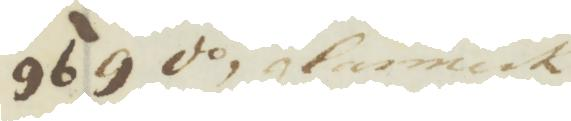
96 9 d:o „glaswerk
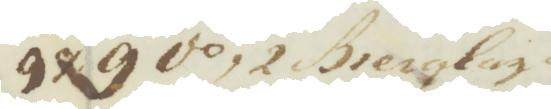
97. 9 d:o 2 Bierglazen
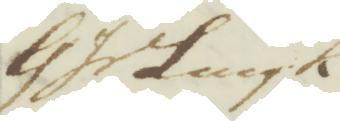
GJVLuyk
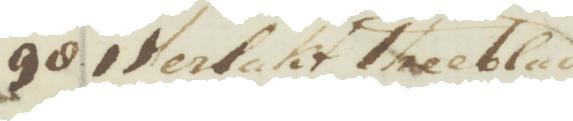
98.1 Verlakt theeblad
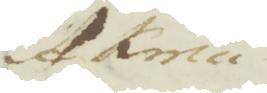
A. Kwee
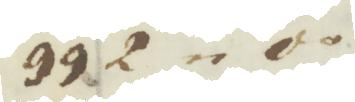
99. 2 „ d:o
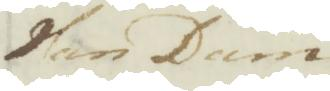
Van Dam
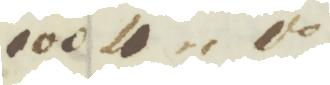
100 4 „ d:o
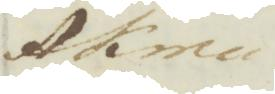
A Kwee
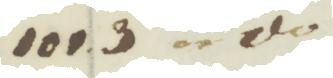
101 3 d:o
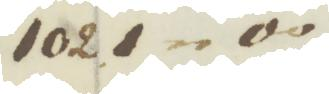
102 1 „ d:o
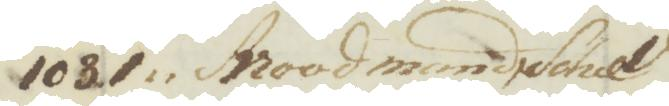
103 1:. Broodmand, schil
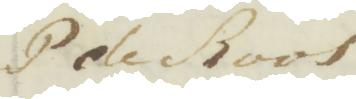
P de Roos
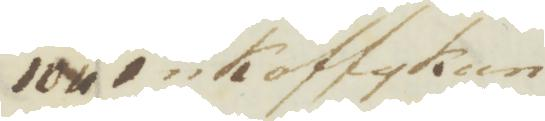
104 1 koffykan
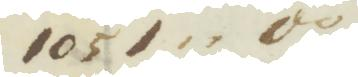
105 1 „ d:o
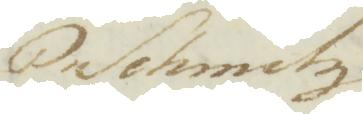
Dr. Schmitz
